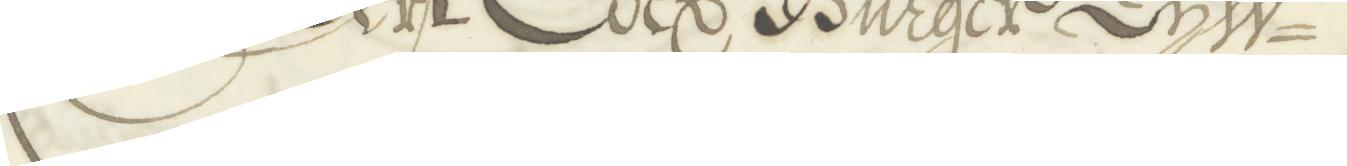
Aert Cocx Burger Eijss=r
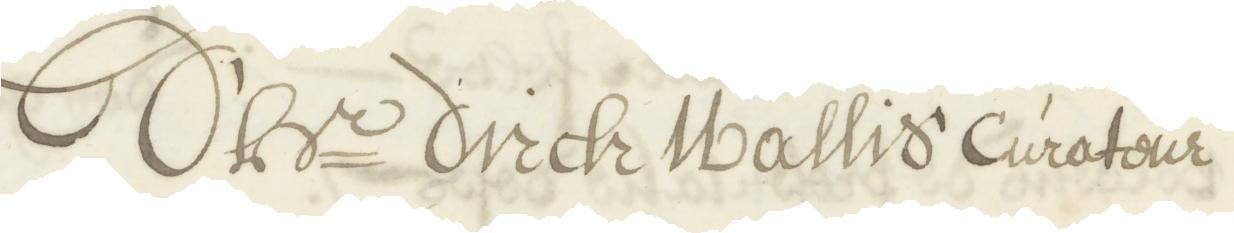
d'H=r dirck Wallis Curateur
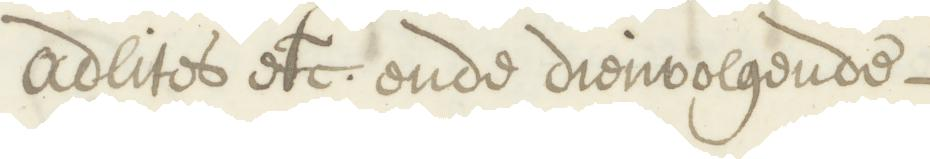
adlites etc. ende dienvolgende —
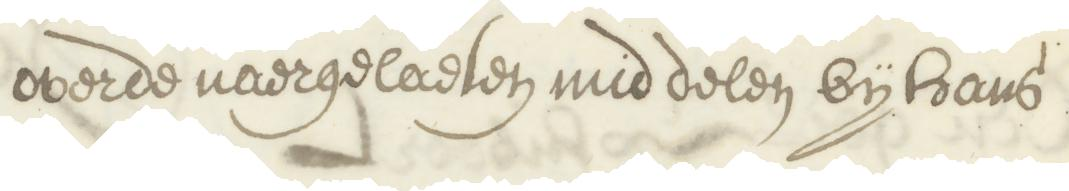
overde naergelaeten middelen bij hans
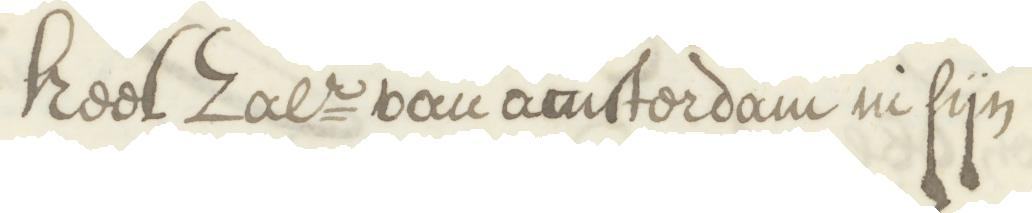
keet zal=r van amsterdam in sijn
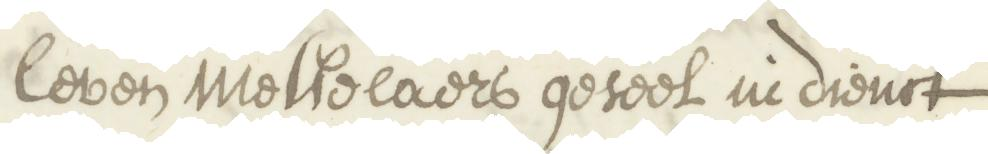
leven metselaers geheel in dienst
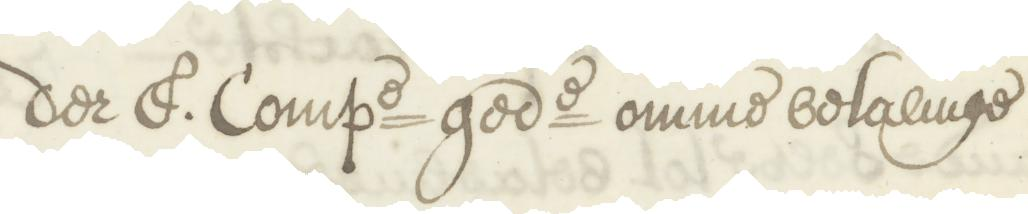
der E. Comp=e ged=e omme betalinge
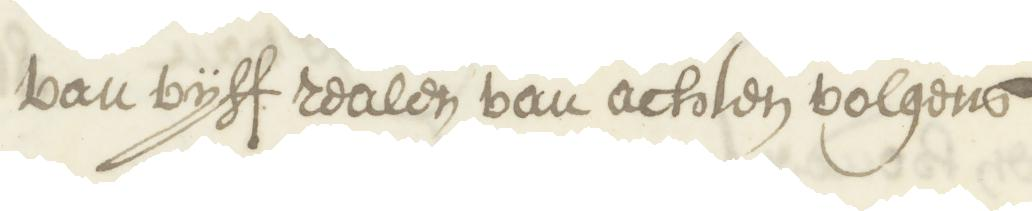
van vijff realen van achten volgens
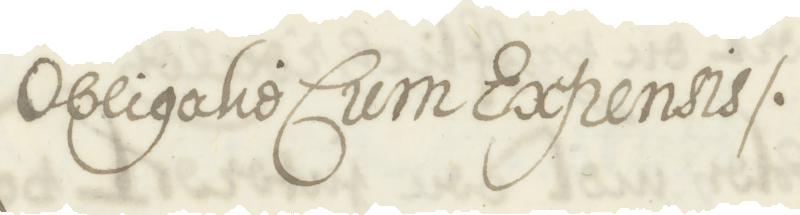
obligatie Cum Expensis/.
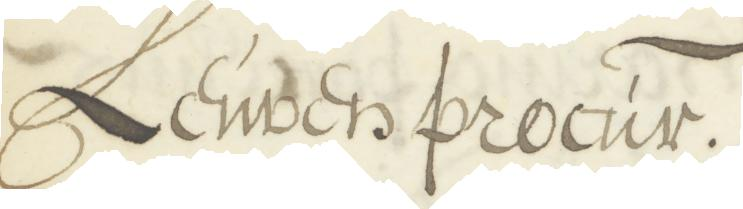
Leuven procur.
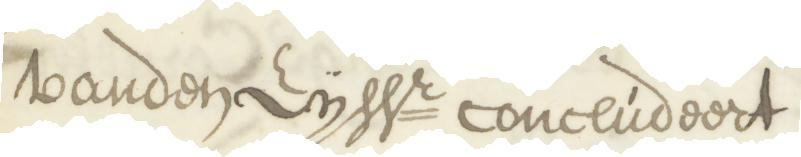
vanden Eijss=r concludeert
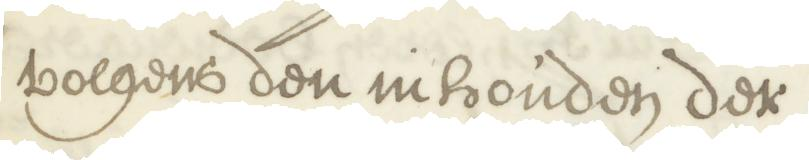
volgens den inhouden der
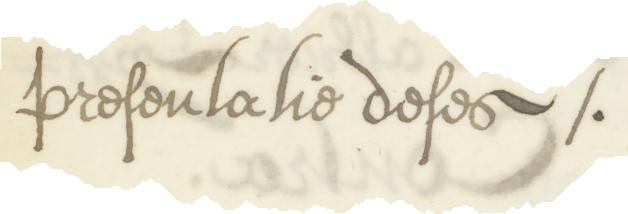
presentatie deses /.
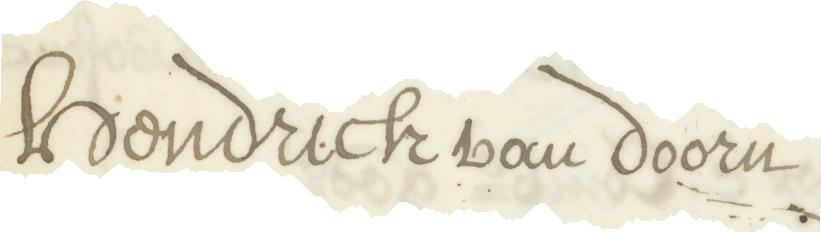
Hendrick van doorn
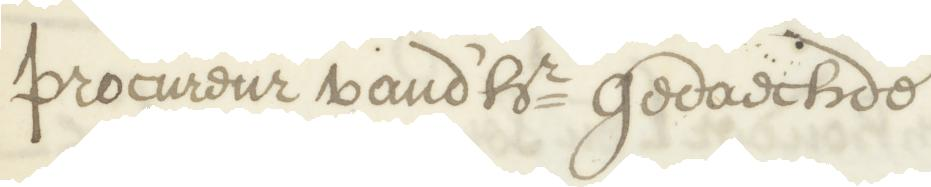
procureur vand’h=r gedaechde
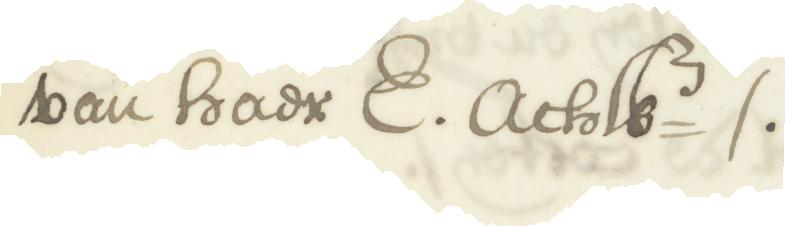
van haer E. Achts=r /.
